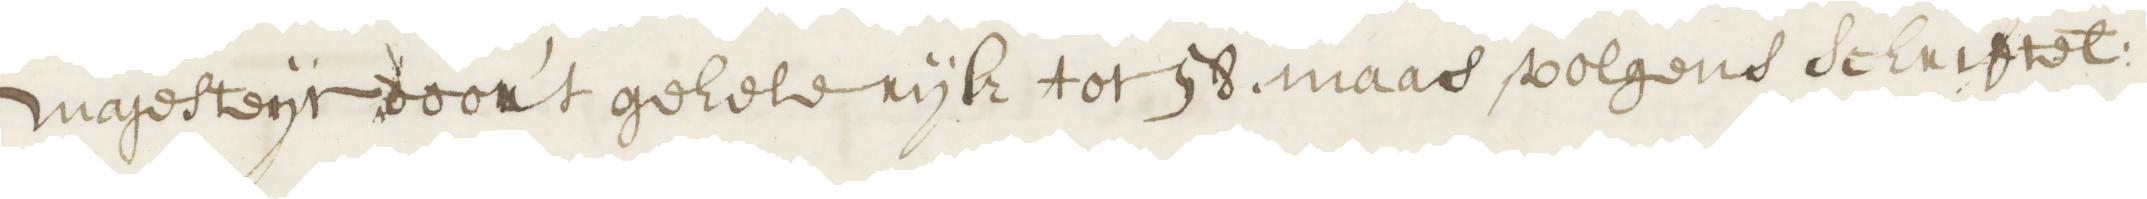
majesteijt, door ’t gehele rijk tot 58. maas volgens schriftel:
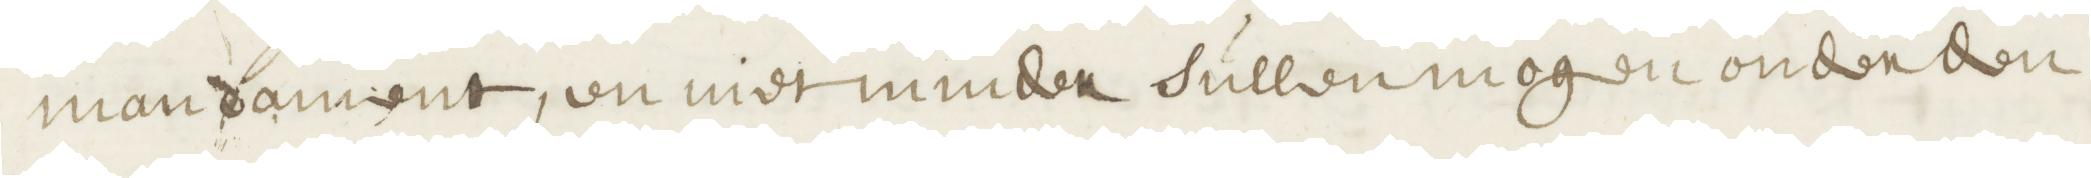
mandament, en niet minder sullen mogen onder den
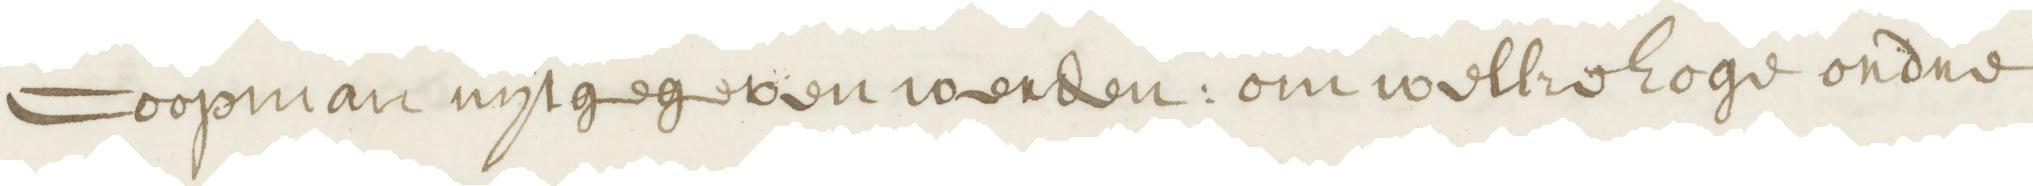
Coopman uijtgegeven werden: om welke hoge ordre
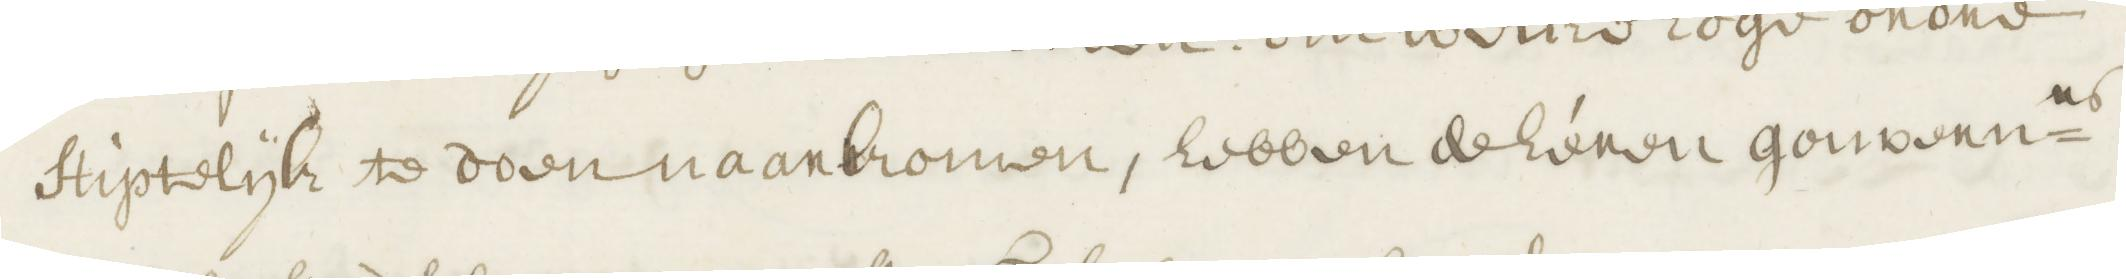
stiptelijk te doen naarkomen, hebben de heren gouvern=rs
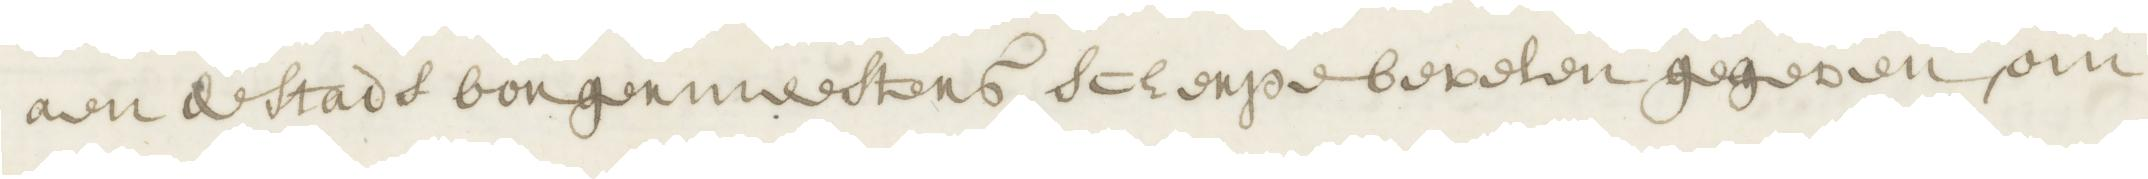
aen de stads borgermeesters scherpe bevelen gegeven, om
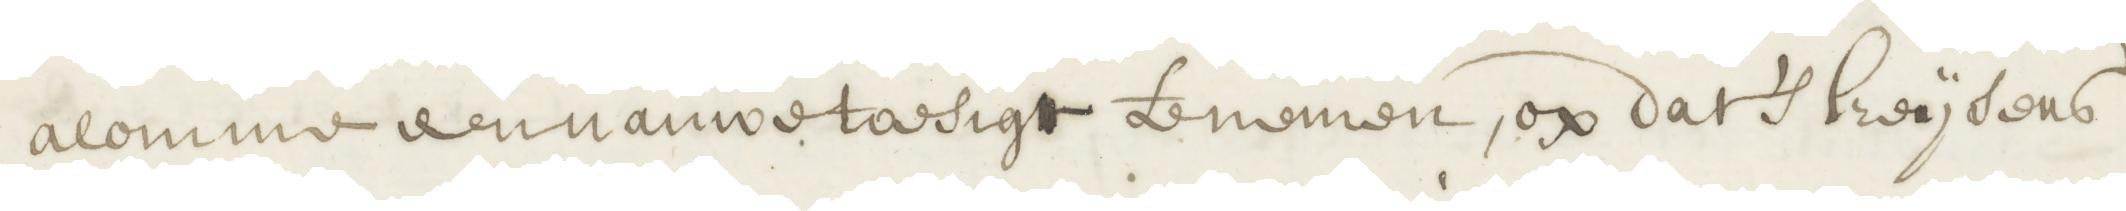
alomme een nauwe toesigt te nemen, op dat 's keijsers
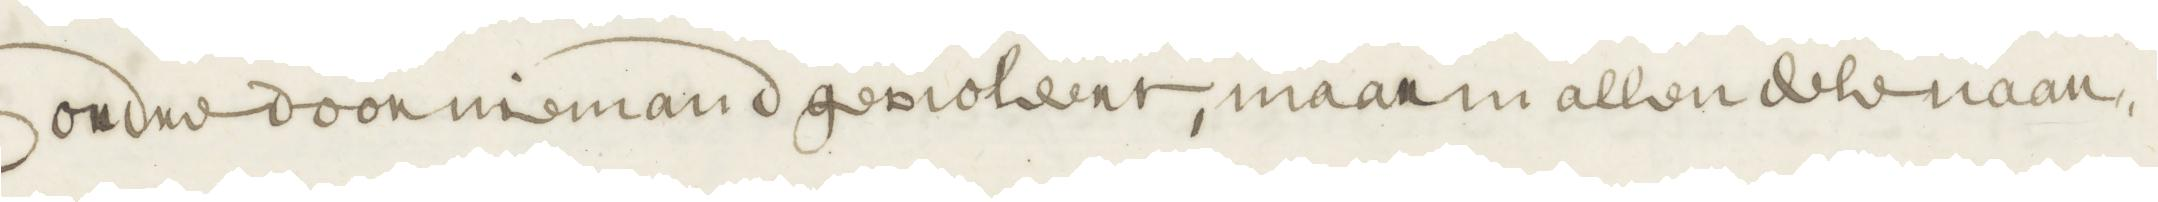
ordre door niemand gevioleert, maar in allen dele naar,
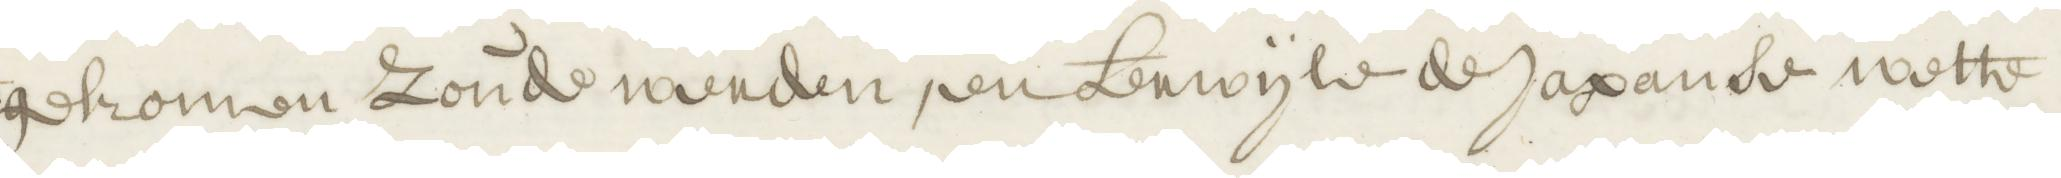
gekomen zoude werden, en terwijle de Japanse wette
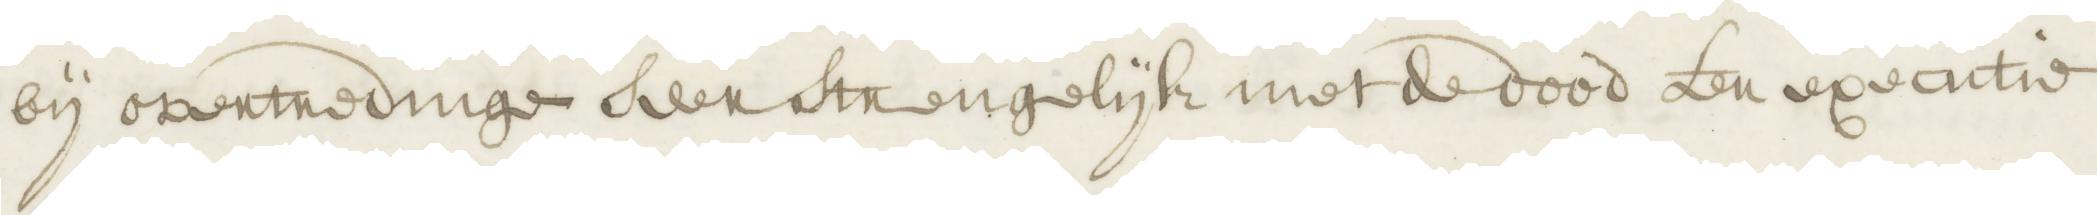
bij overtredinge seer strengelijk met de dood ter executie
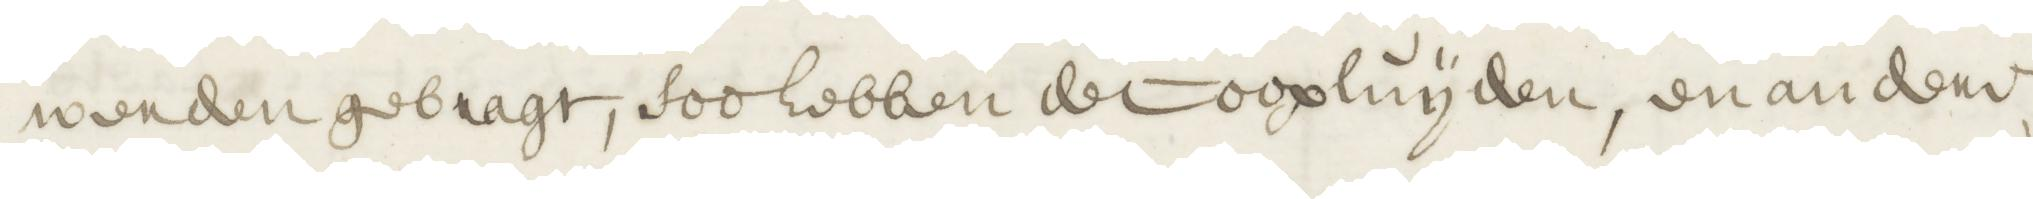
werden gebragt, soo hebben de coopluijden, en andere
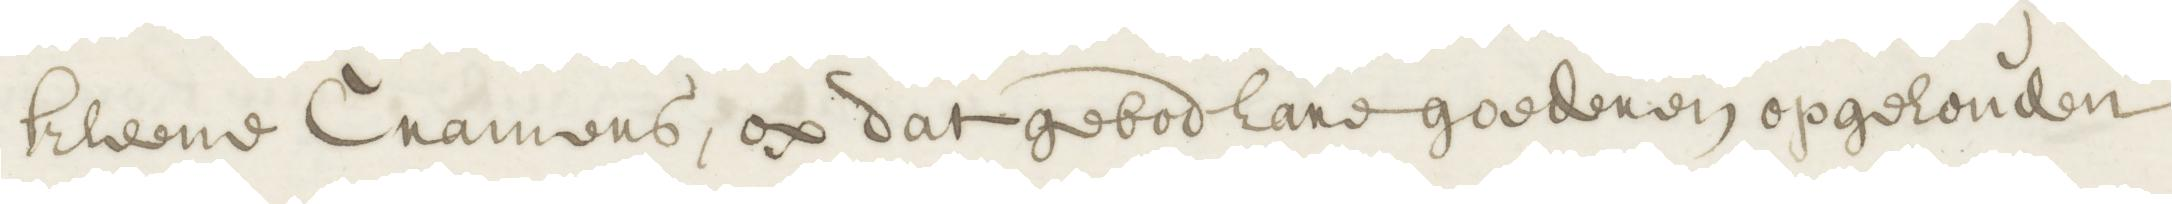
kleene Cramers, op dat gebod hare goederen opgehouden
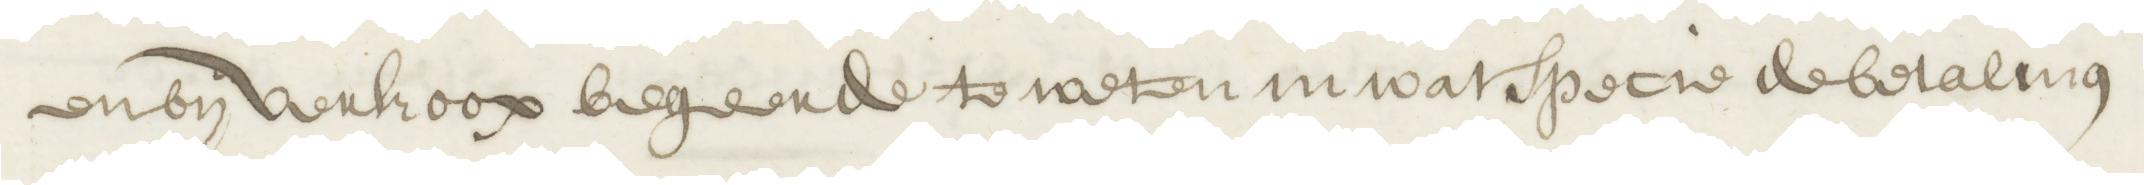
en bij verkoop begeerde te weten in wat specie de betaling
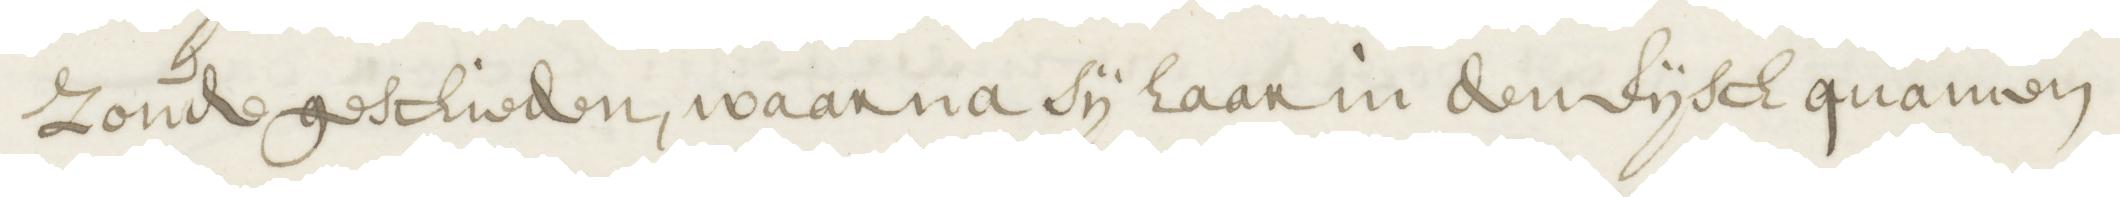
zoude geschieden, waar na sij haar in den Eijsch quamen
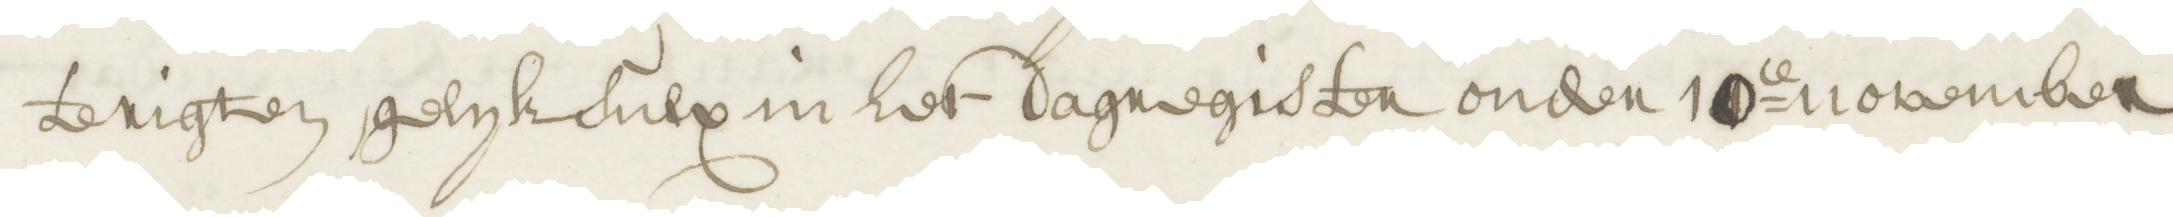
terigten gelyk sulx in het dagregister onder 10=e november
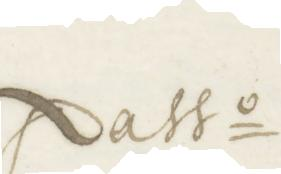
Pass=o
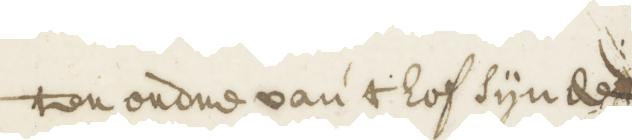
ter ordre van ’t hof sijn de
